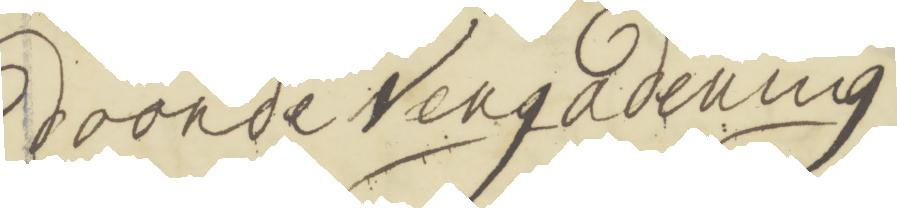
door de vergadering
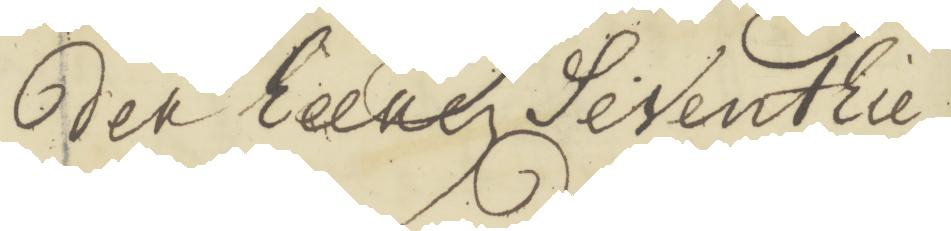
der heeren Seventhie„
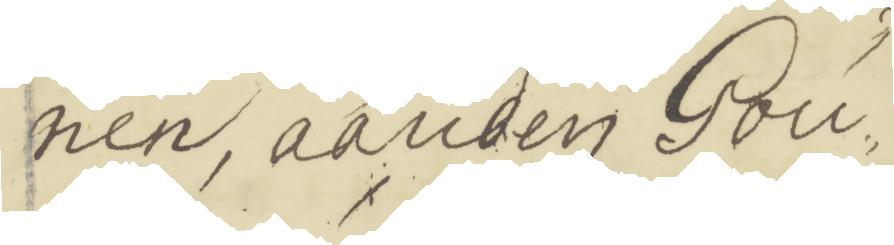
nen, aanden Gou„
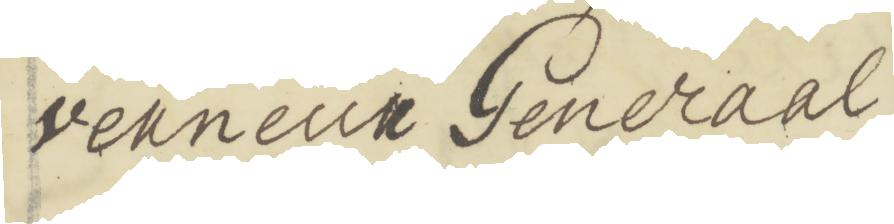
verneur Generaal,
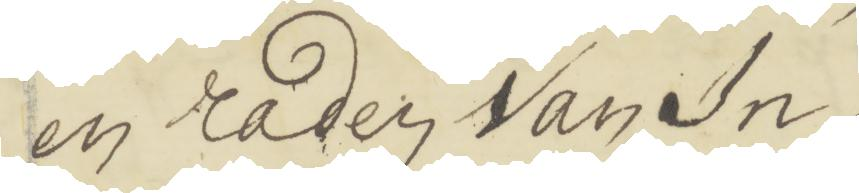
en raden van In
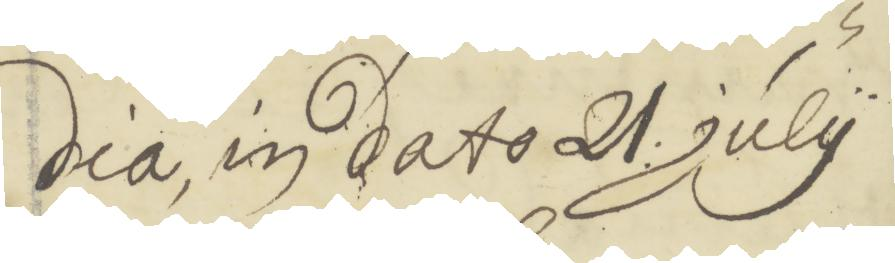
dia, in dato 21: julij
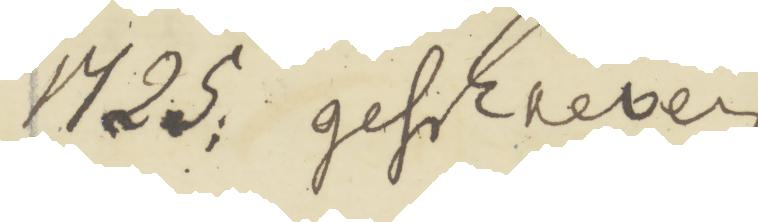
1725: geschreven
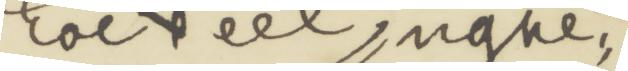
hoe veel jngre„
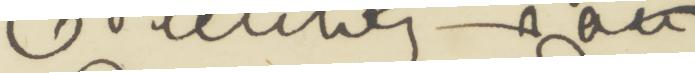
dienten van
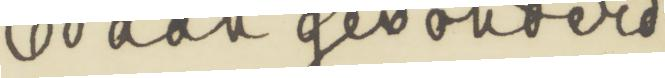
daar gevorderd
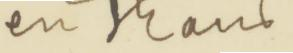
en thans
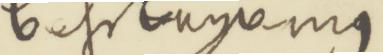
beschrijving
